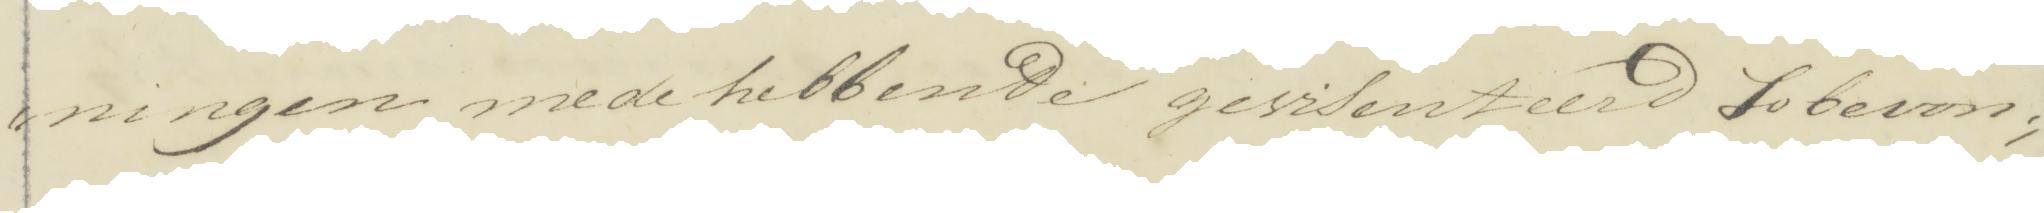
„ningen mede hebbende gevisenteerd so bevon„
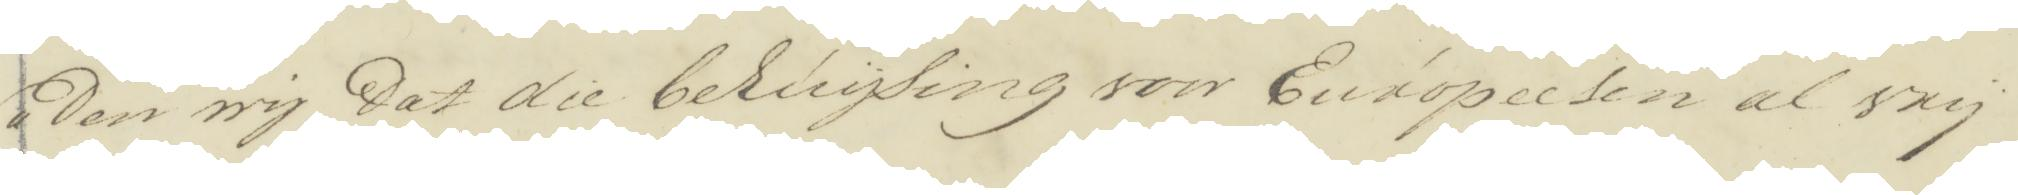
den wij dat die behuijsing voor Europeesen al vrij
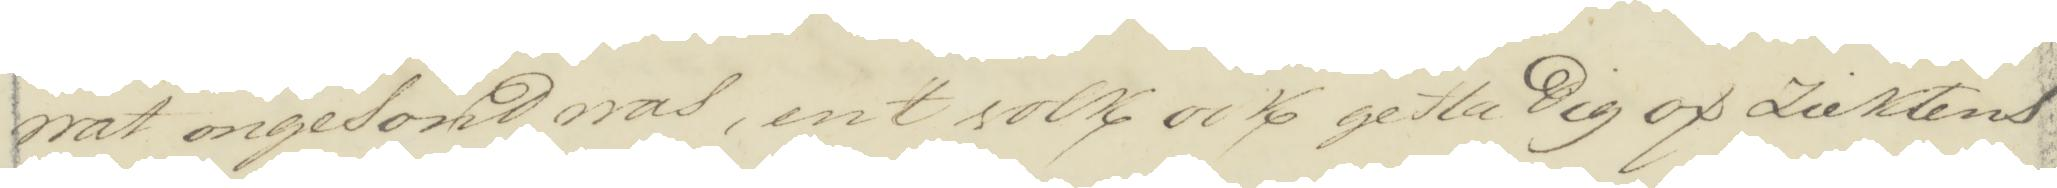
wat ongesond was, en ’t volk ook gesta dig over ziektens
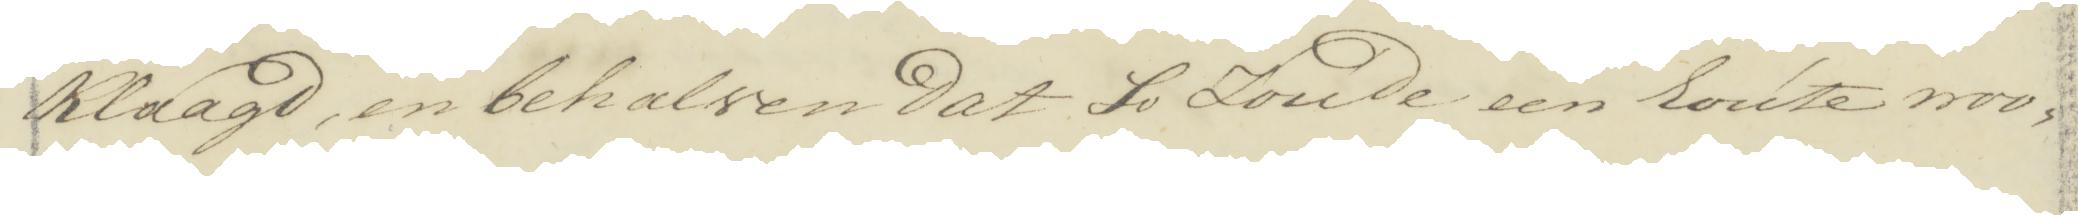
klaagd, en behalven dat so zoude een houte woo„
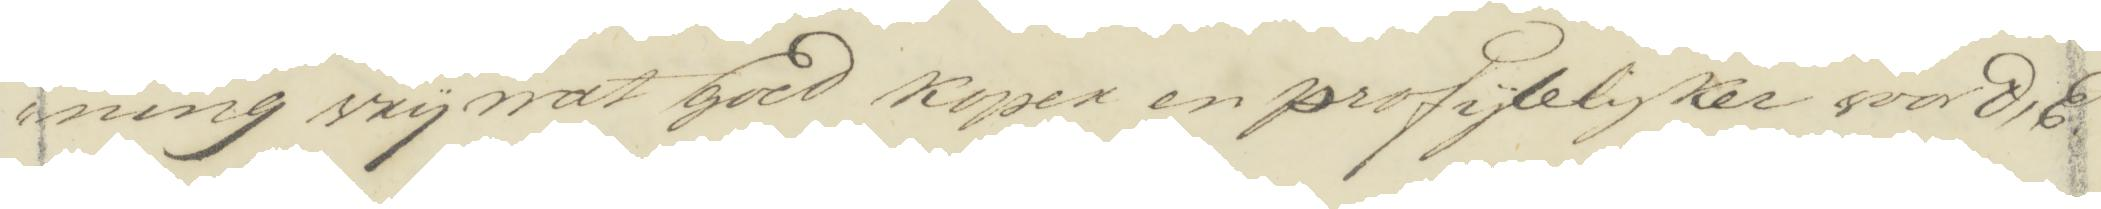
„ning vrij wat goed koper en profijtelijker voor D, E
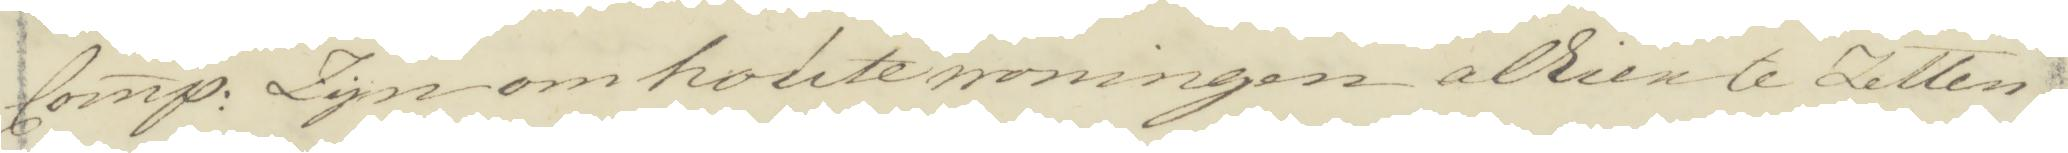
Comp: zijn om houte woningen alhier te zetten
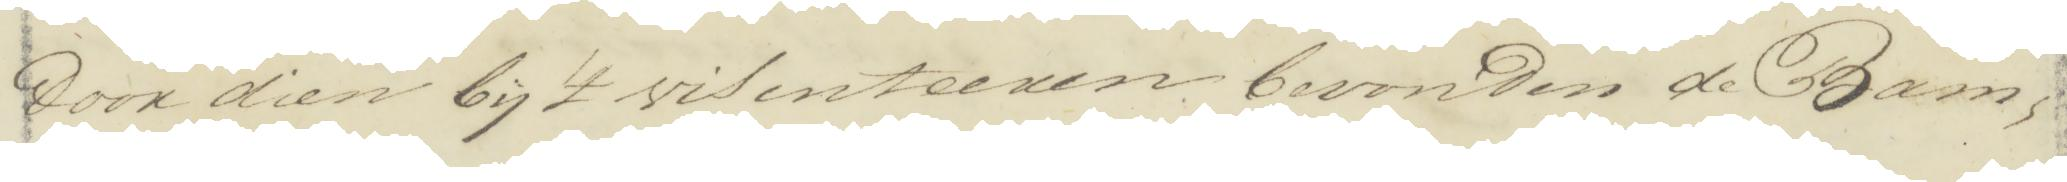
door dien bij ’t visenteeren bevonden de Bam„
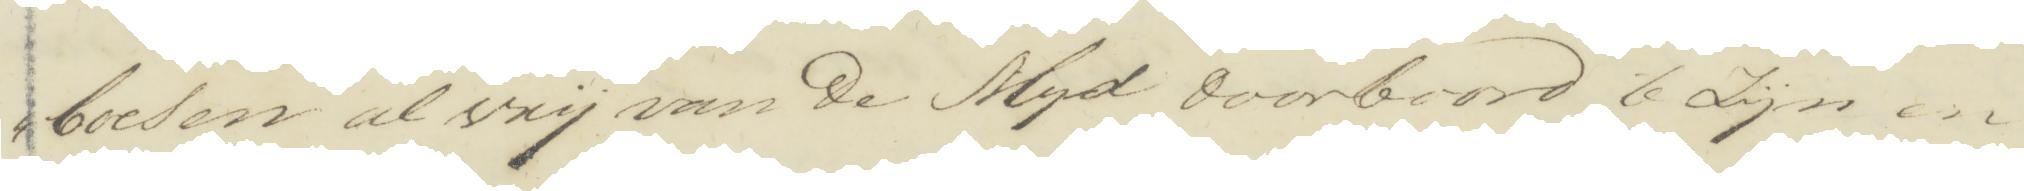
„boesen al vrij van de Myd doorboord te zijn en
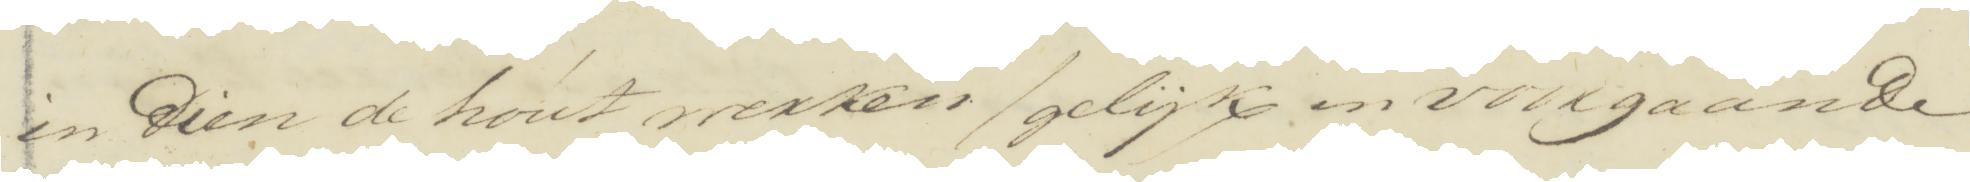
in dien de hout werken /gelijk in voorgaande
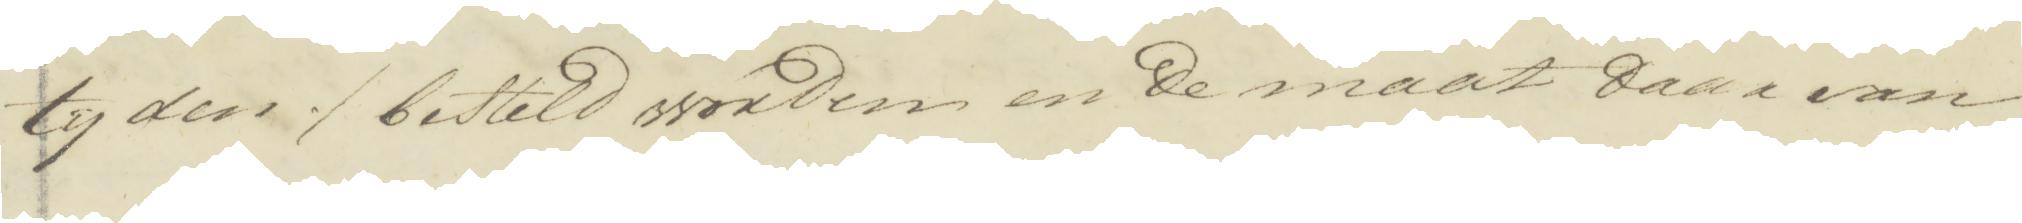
tijden:/ besteld worden en de maat daar van
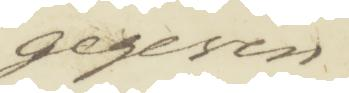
gegeven
